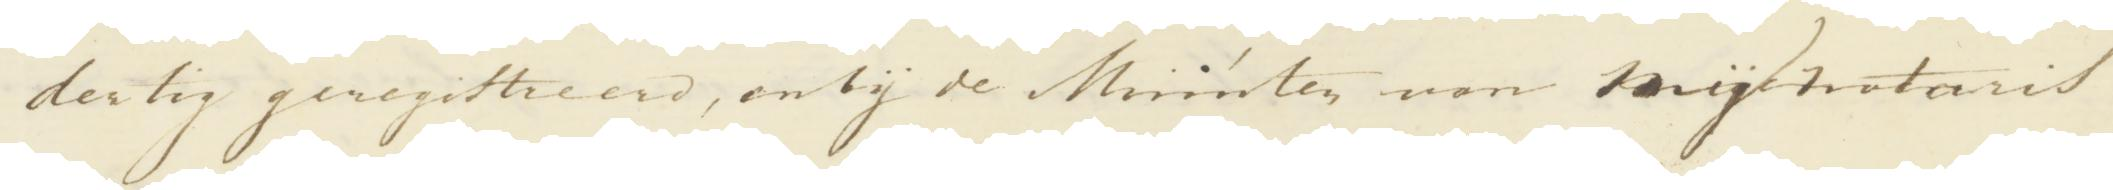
dertig geregistreerd, en bij de Minuten van mij notaris
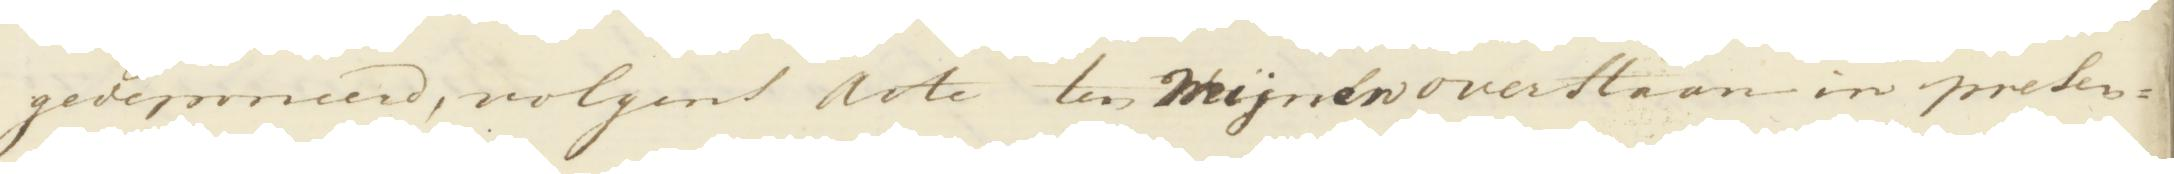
gedeponeerd, volgens acte ten mijnen overstaan in presen=
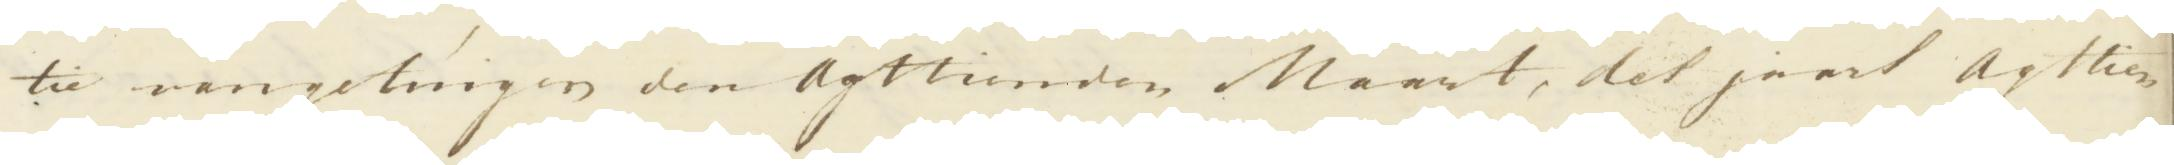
tie van getuigen den agttienden Maart, des jaars agttien
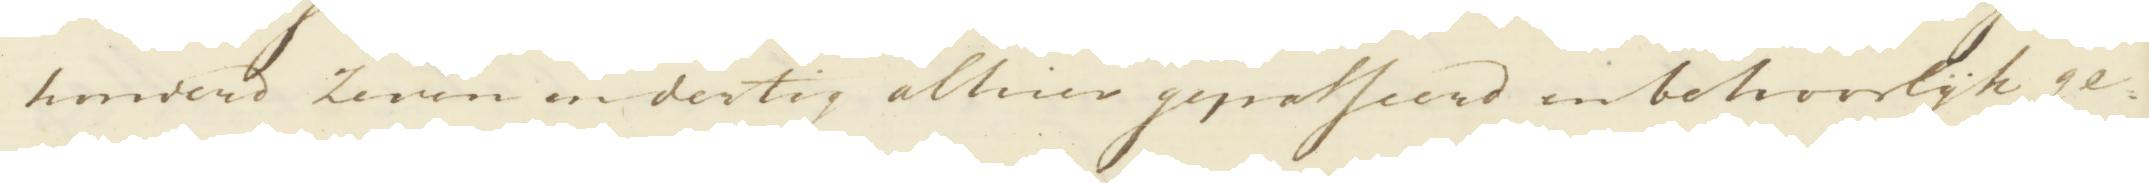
honderd zeven en dertig alhier gepasseerd en behoorlijk ge=
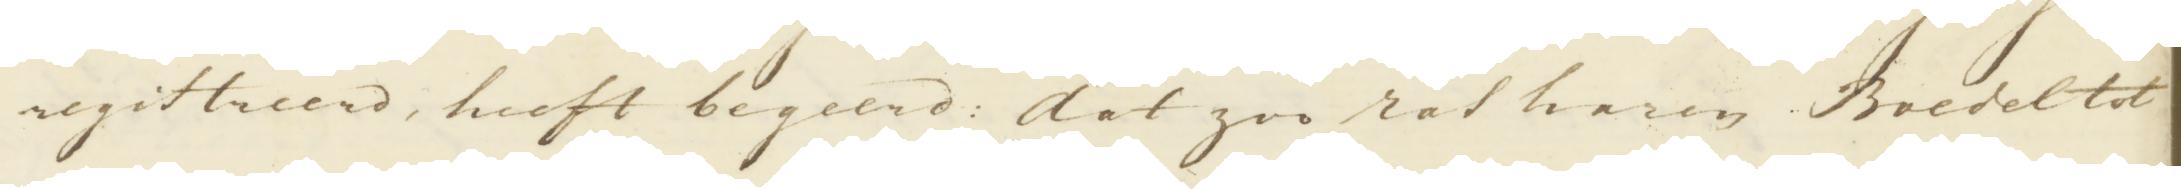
registreerd, heeft begeerd: dat zoo ras haren Boedel tot
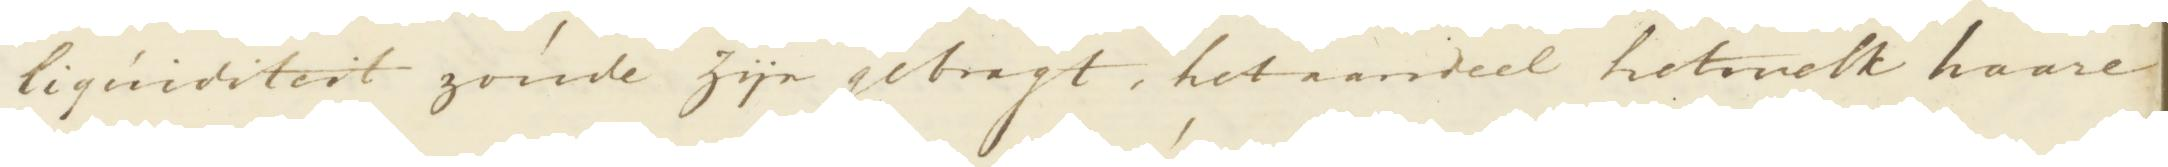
liquiditeit zoude Zijn gebragt, het aandeel hetwelk haare
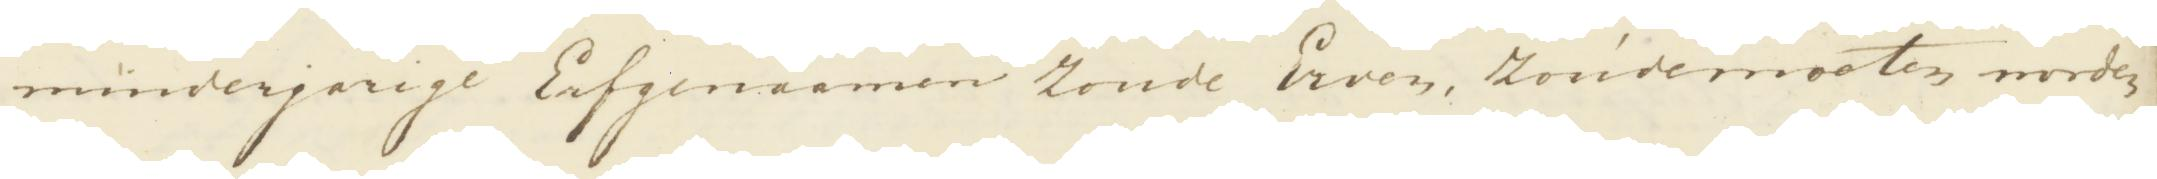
minderjarige Erfgenaamen zoude Erven, zoude moeten worden
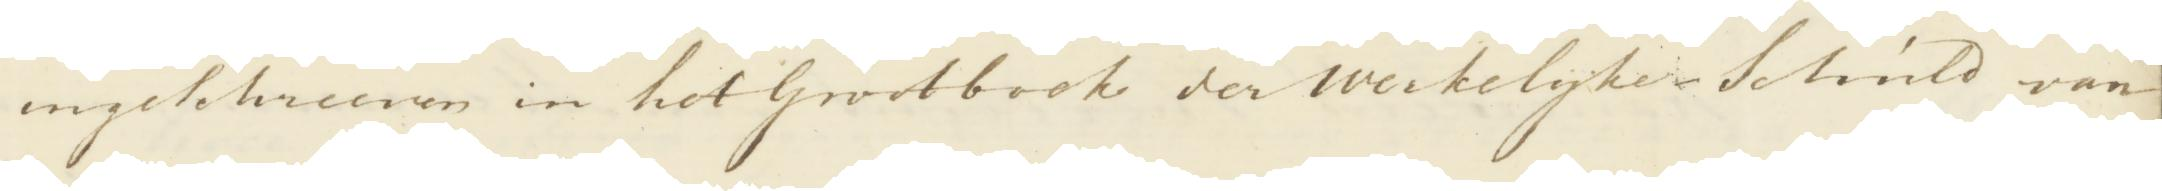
ingeschreeven in het Grootboek der werkelijke - Schuld van
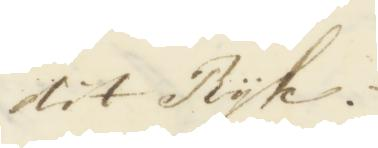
dit Rijk.
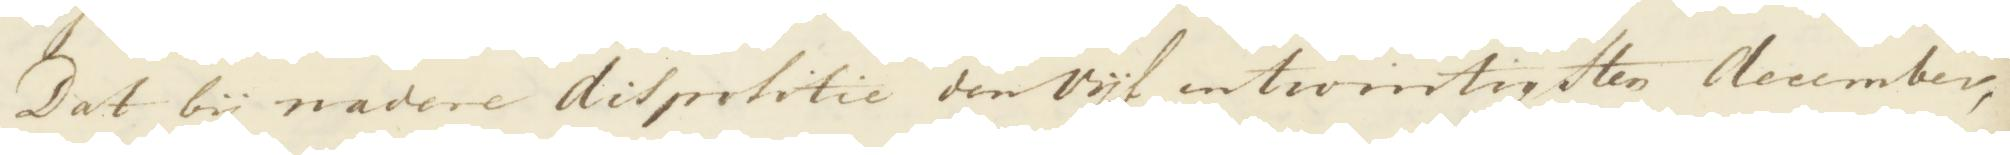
Dat bij nadere dispositie den vijf en twinstigsten december,
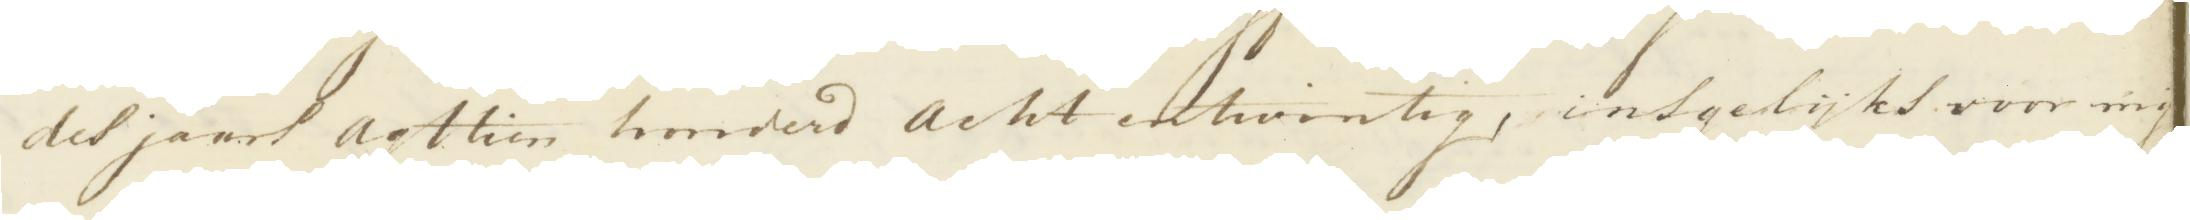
des jaars agttien honderd acht en twintig, insgelijks voor mij
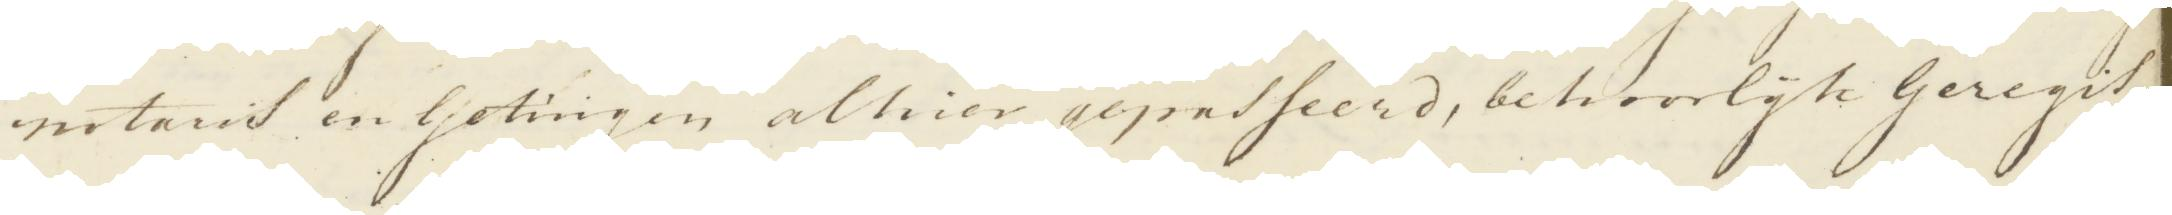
notaris en getuigen alhier gepasseerd, behoorlijk geregis=
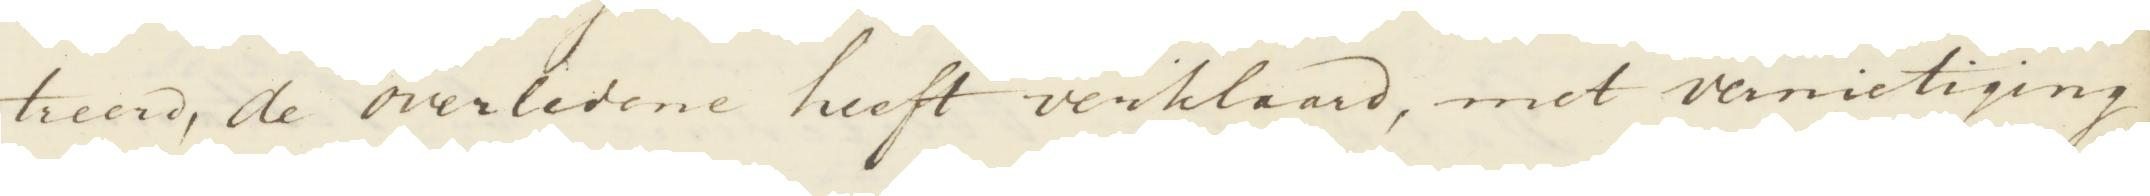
treerd, de overledene heeft verklaard, met vernietiging
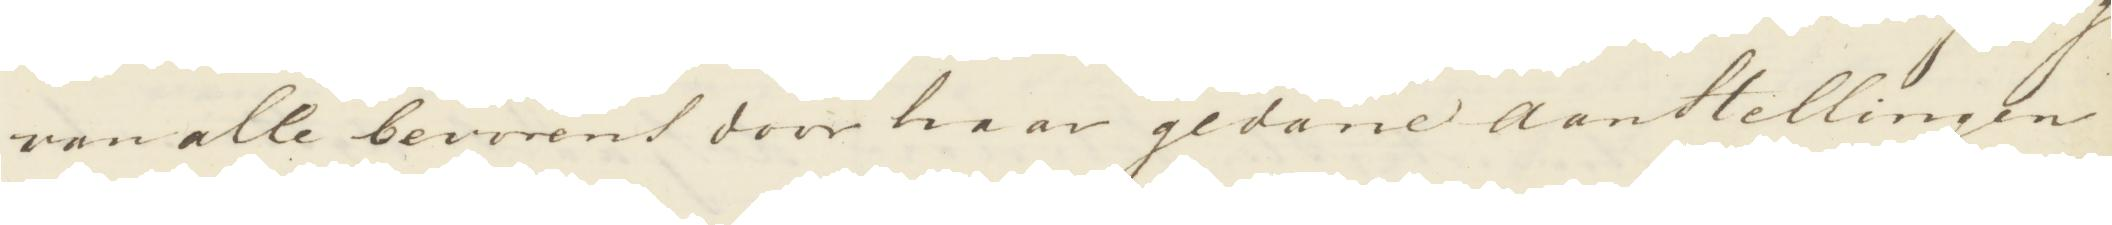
van alle bevorens door haar gedane aanstellingen
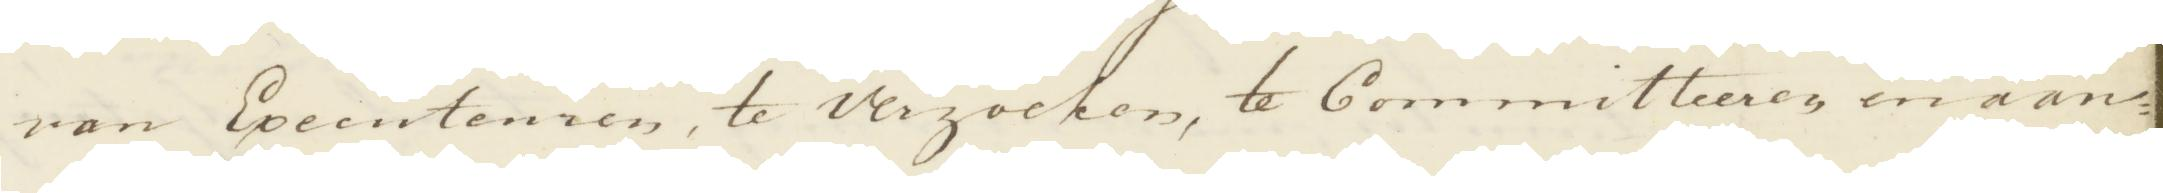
van Executeuren, te verzoeken, te Committeeren en aan=
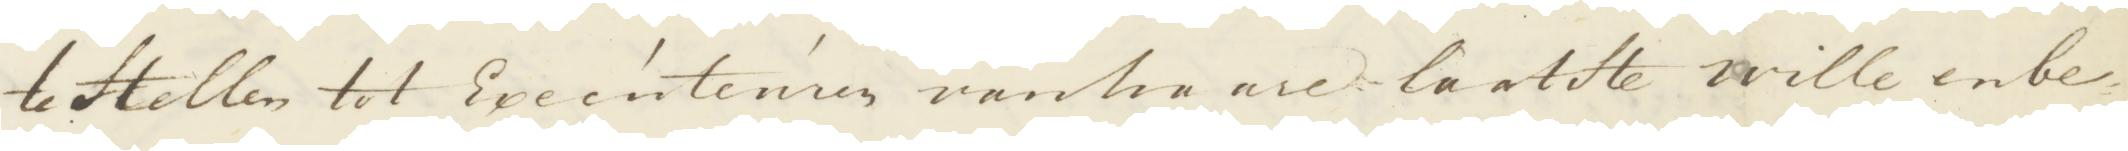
te Stellen tot Executeuren van haare laatste wille en be=
